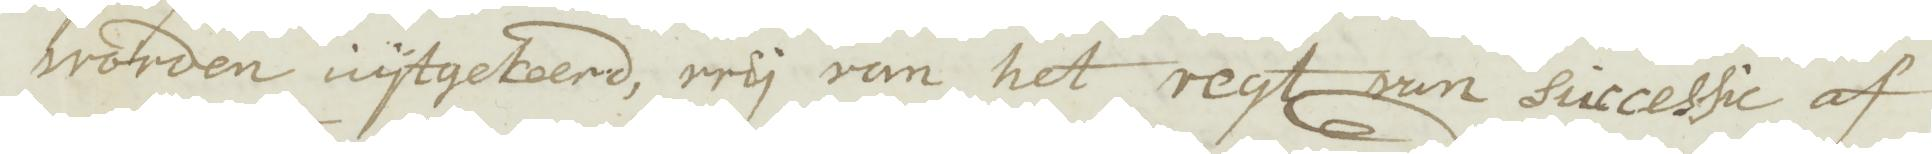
worden uijtgeleerd, vrij van het regt van successie of
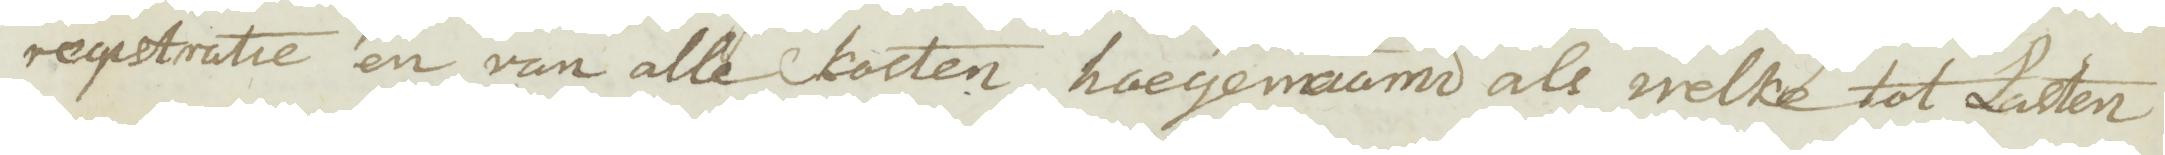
registratie en van alle kosten hoegemaamd als welke tot Lasten
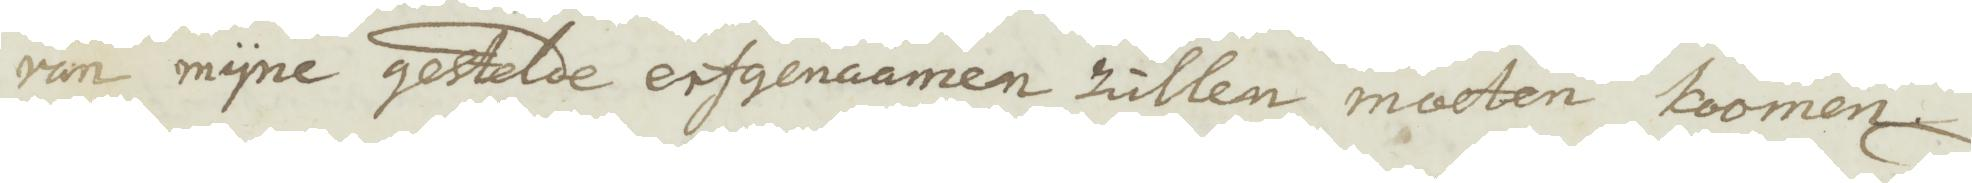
van mijne gestelde erfgenaamen zullen moeten koomen.
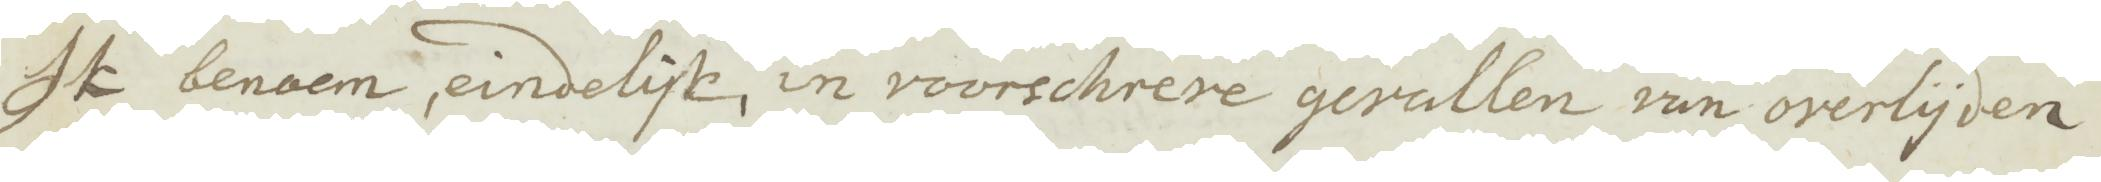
Ik benoem, eindelijk, in voorschreve gevallen van overlijden
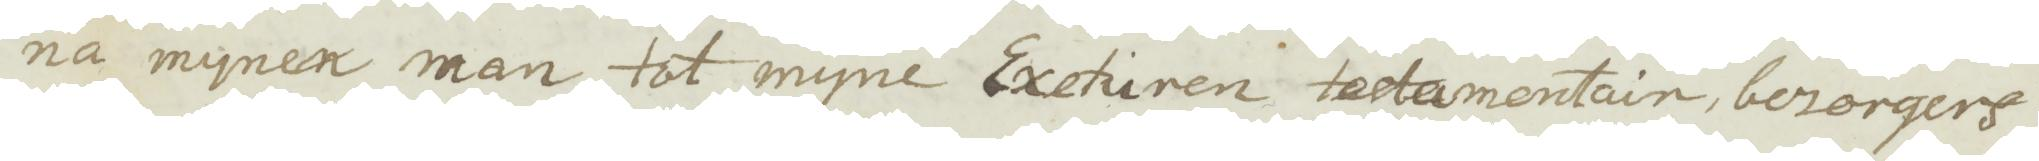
na mynen man, tot mijne Exeturen testamentair, bezorgers
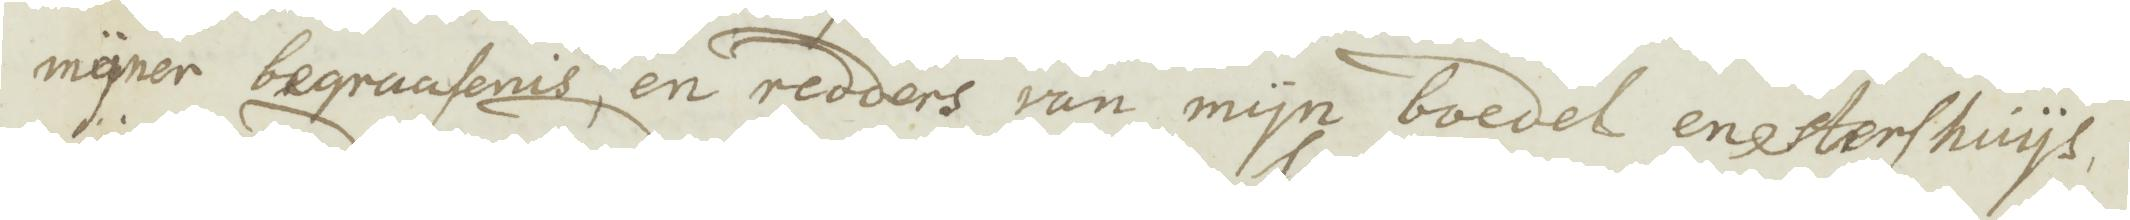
mijner begraafenis en redders van mijn boedel en sterfhuijs,
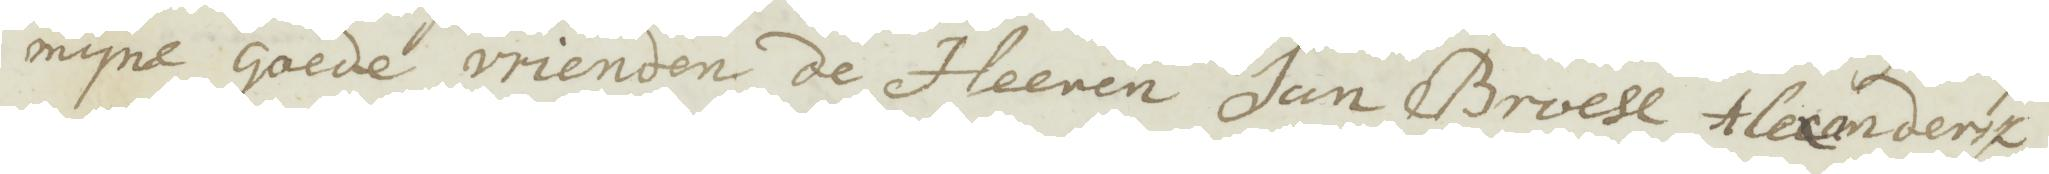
mijne goede vrienden de Heeren Jan Broese Alexandersz
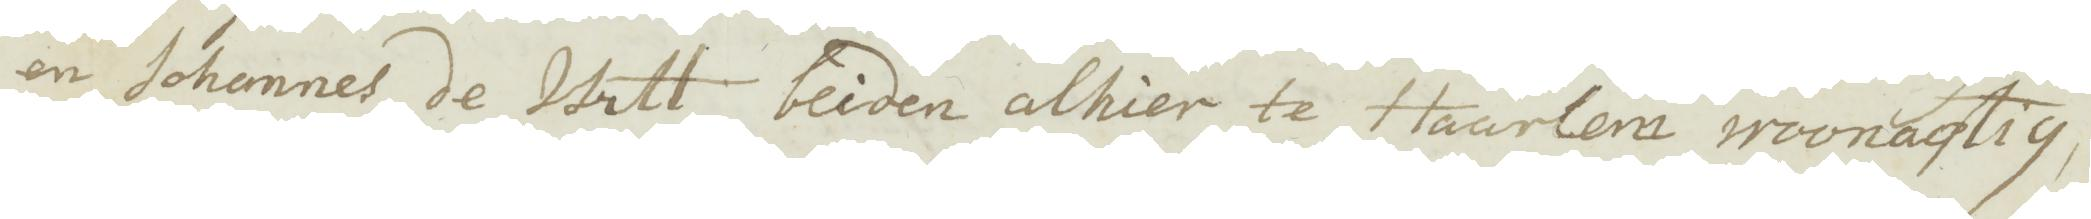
en Johannes de Witt, beiden alhier te Haarlem woonagtig,
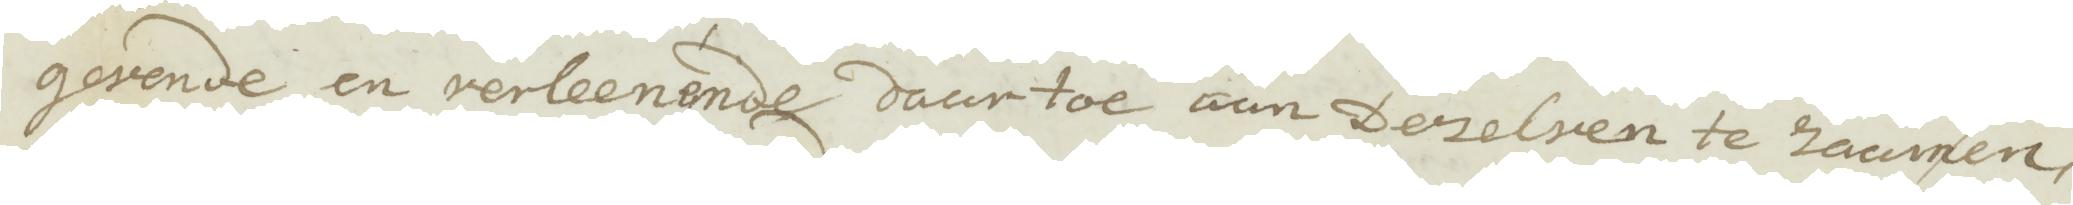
gevende en verleenende daar toe aan Dezelven te zaamen,
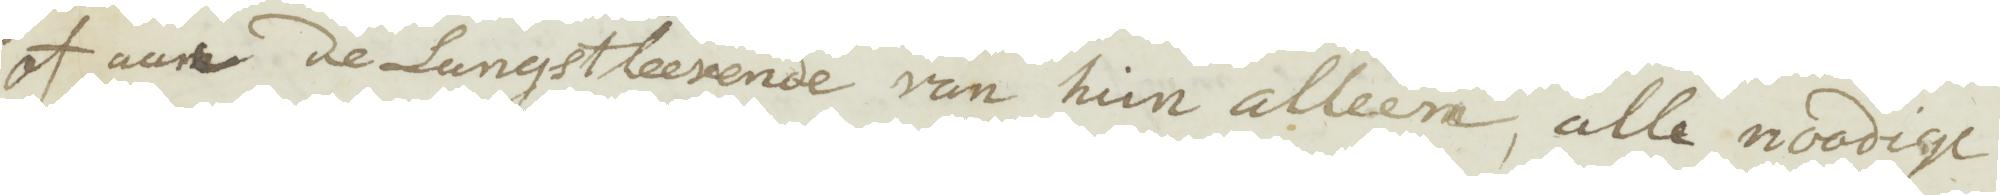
of aan de Langstleevende van hun alleen, alle noodige
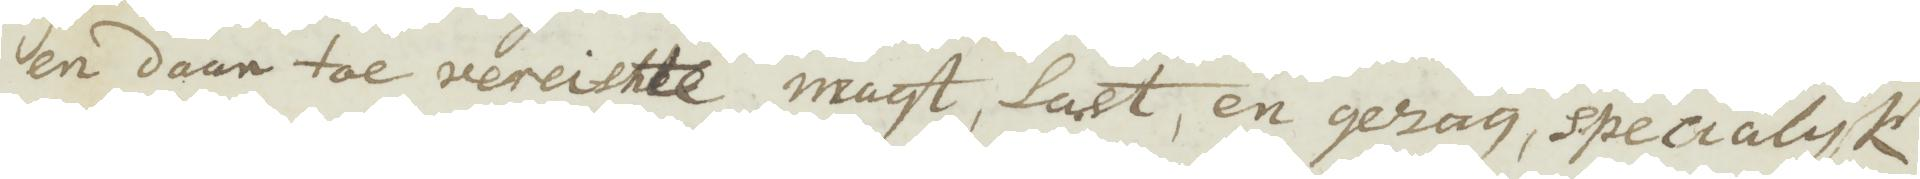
en daar toe vereishte magt, Last, en gezag, specialyk
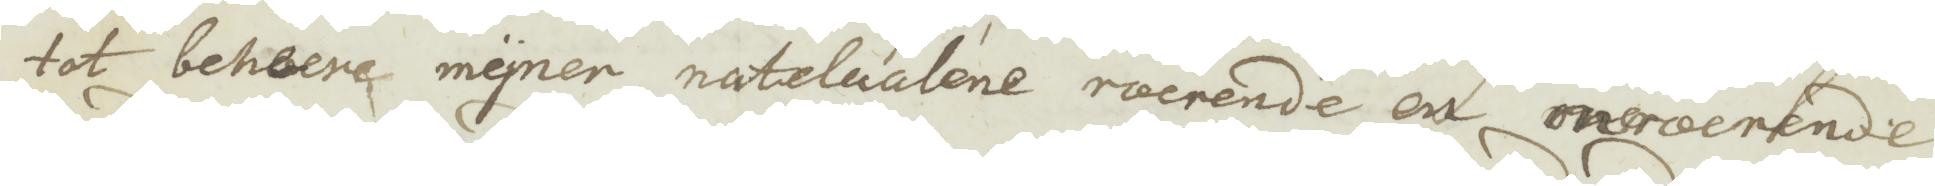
tot behoeve mijner natelaatene roerende en onroerende
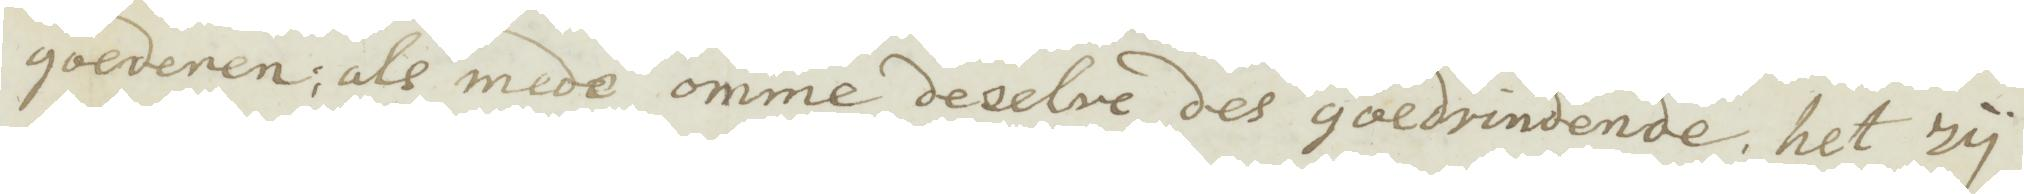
goederen; als mede omme dezelve des goedvindende, het zij
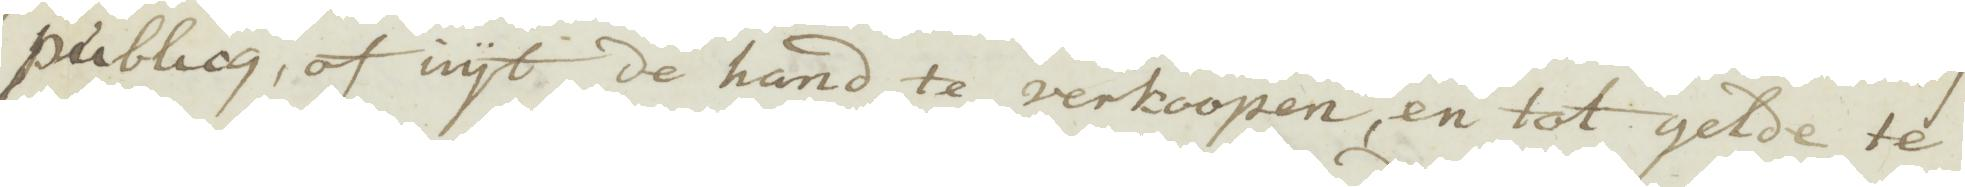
publicq, of uijt de hand te verkoopen, en tot gelde te
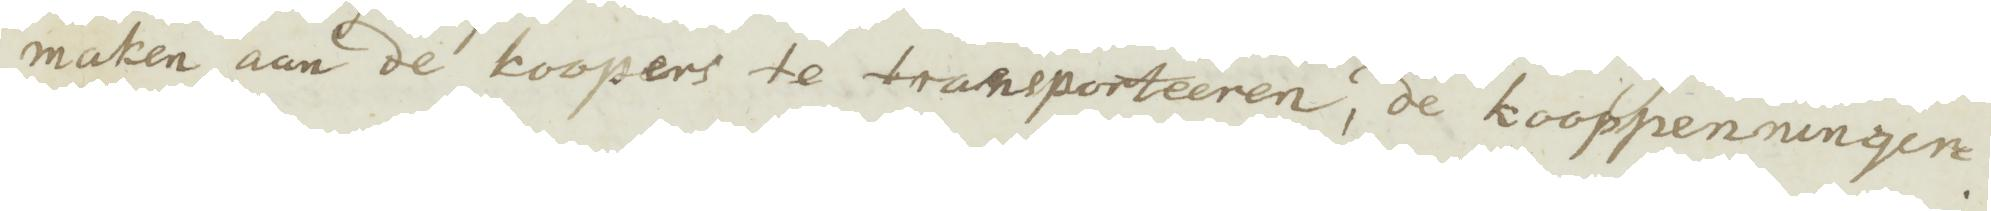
maken aan de koopers te transporteeren, de kooppenningen
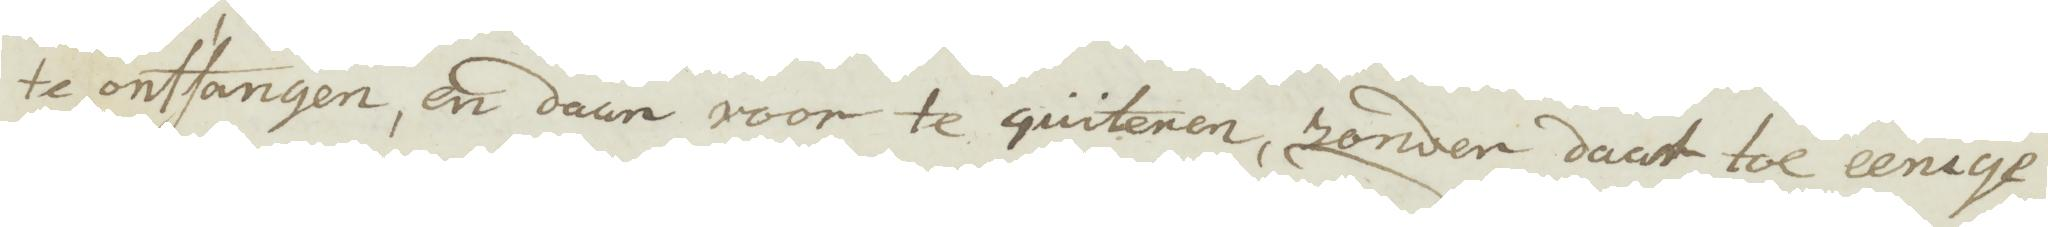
te ontfangen, en daar voor te quiteren, zonder daar toe eenige
